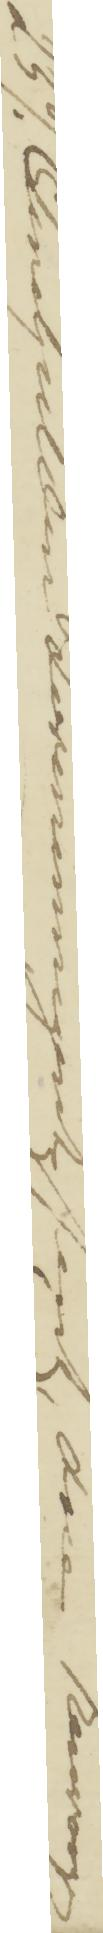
23% Eene Gulden Zevenennegentig Cents, dezen renvooy
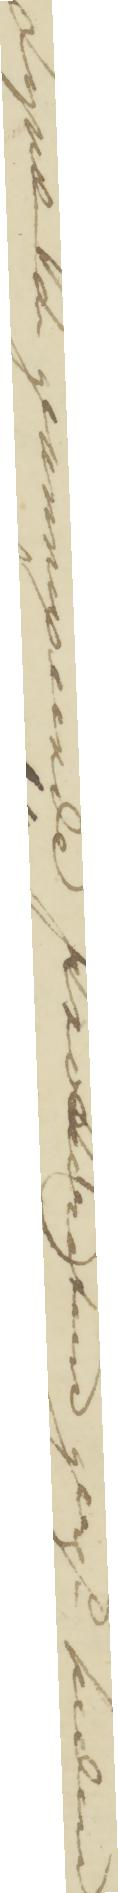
Zynde de geannexeerde Procuratien gereg-d heden
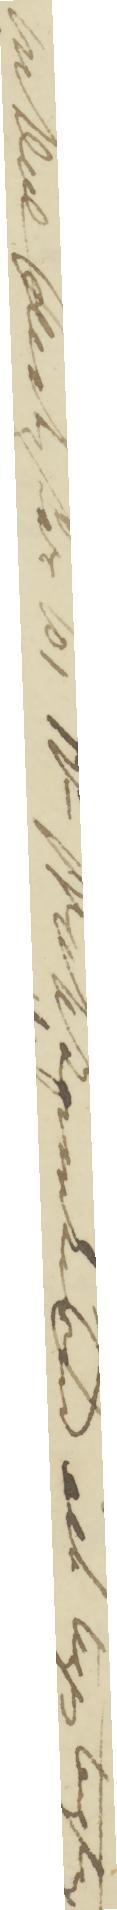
inDeel dertig fol 101 R=o vakZesenZeven elk tegen tagtig
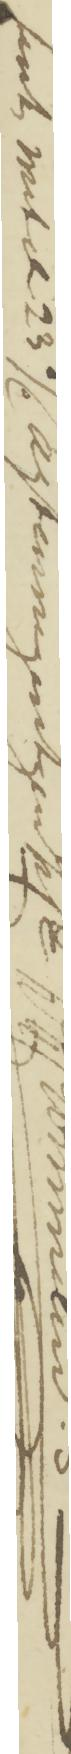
Cents met de 23% agtennegentigen½ C=s DFCrommelin.
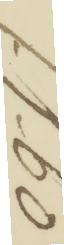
ƒ 1.60
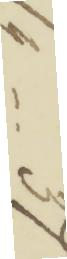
„ — - 37
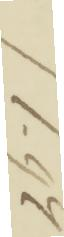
ƒ 1.97
